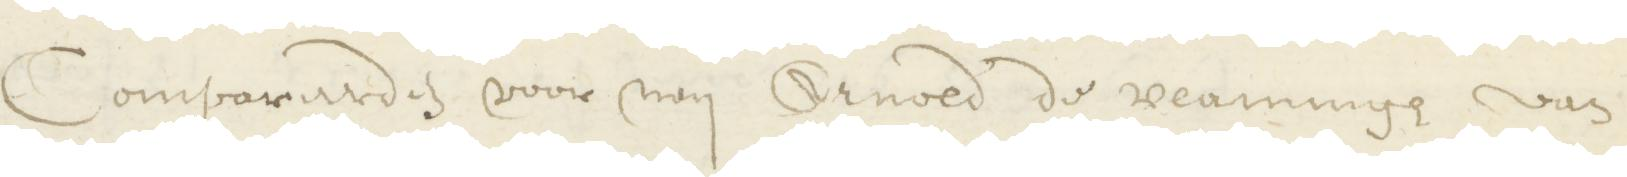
Compareerden voor my Arnold de vlamingh van
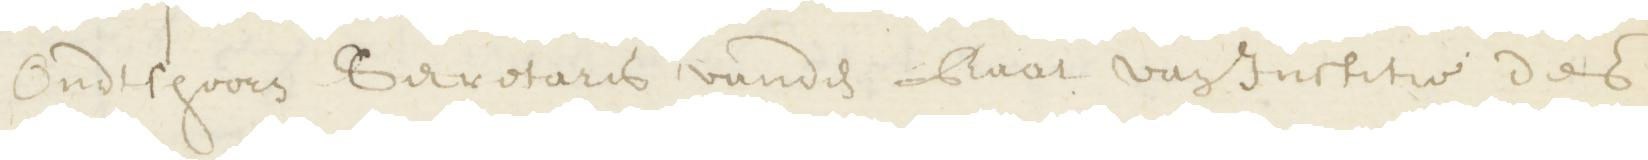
Oudsthoorn Secretaris vanden Raat van Justitie des
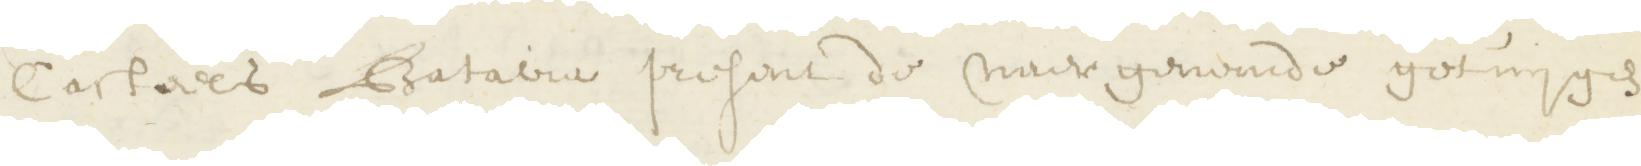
Casteels Batavia present de naergenoemde getuijgen
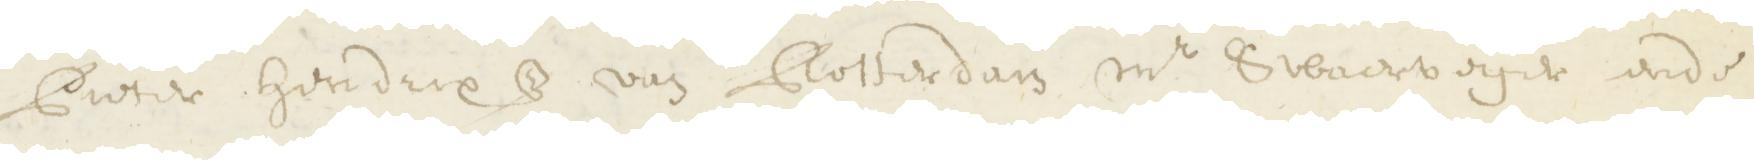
Pieter Hendrixsz van Rotterdam m.r Swaertveger ende
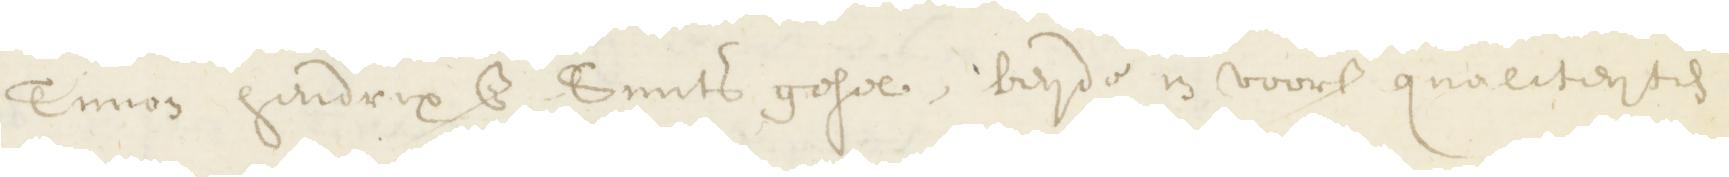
Timen hendrixsz Smits gesel, beyde in voorsz qualiteyten
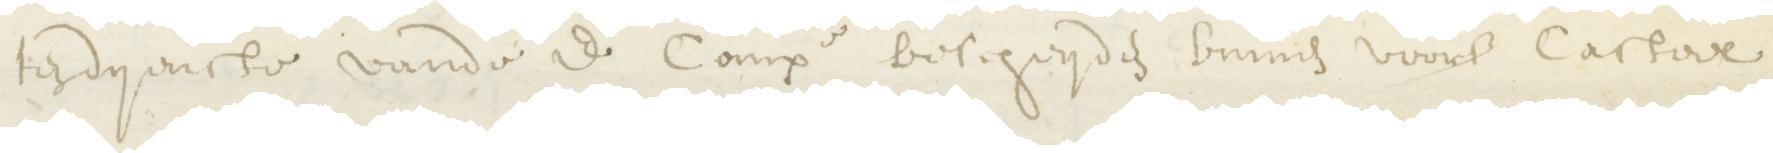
ten dyenste vande E Comp' bescheyden binnen voorsz Casteel
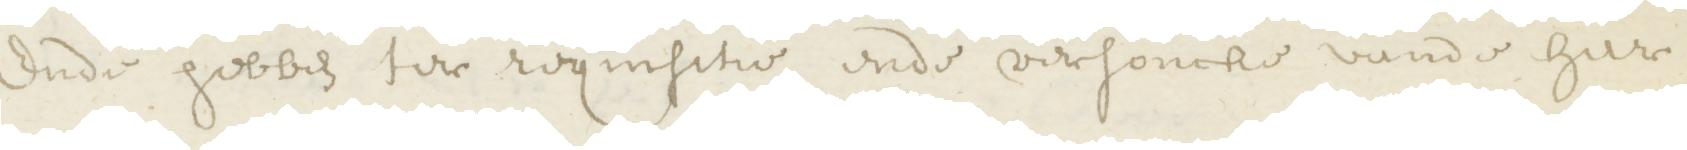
Ende hebben ter requisitie ende versoucke vande heer
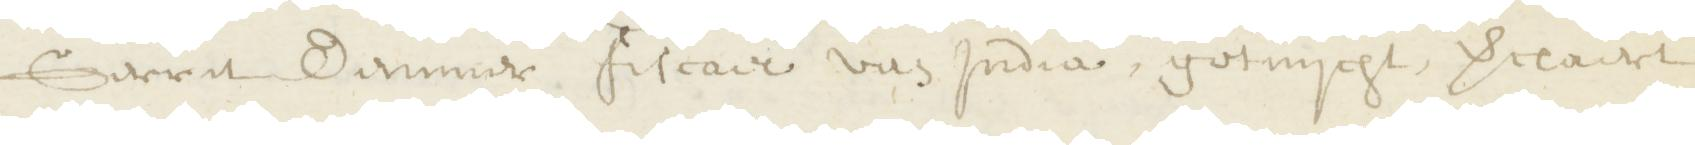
Gerrit Demmer fiscael van India, getuycht, verclaert
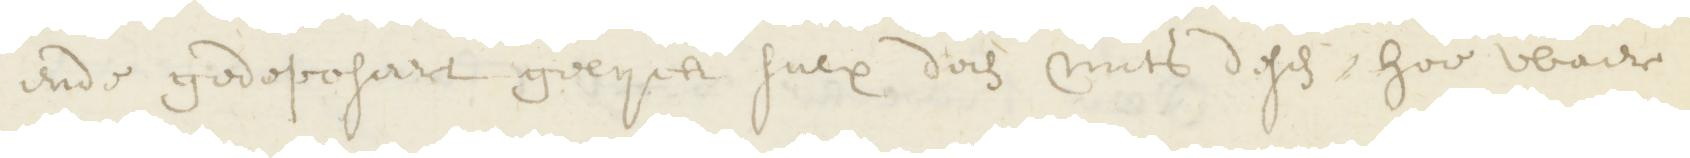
ende gedeposeert gelyck sulx doen mits desen, hoe waer
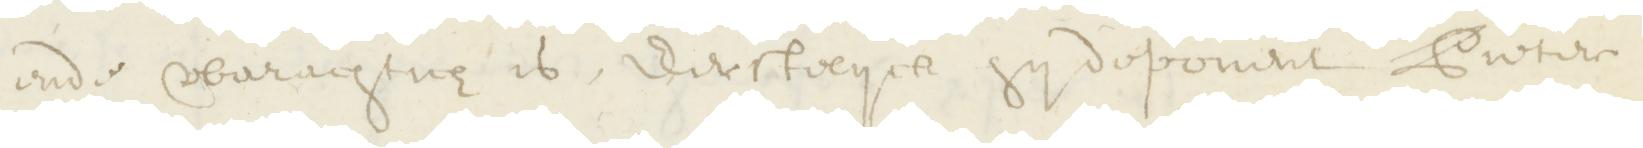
ende waragtich is, Eerstelyck hy deponent Pieter
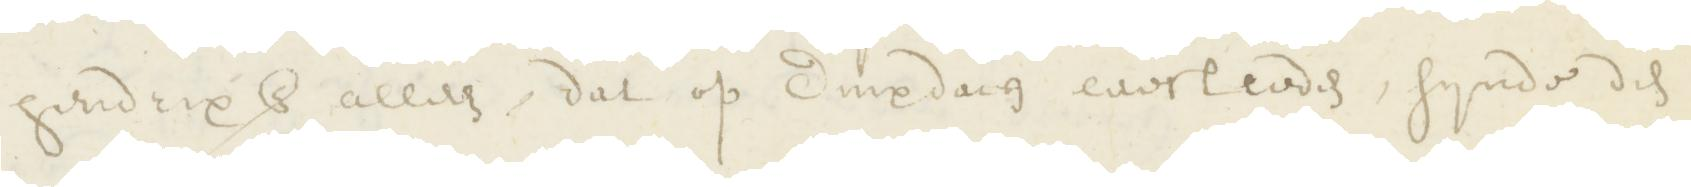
hendrixsz alleen, dat op dinxdach laastleden, synde dien
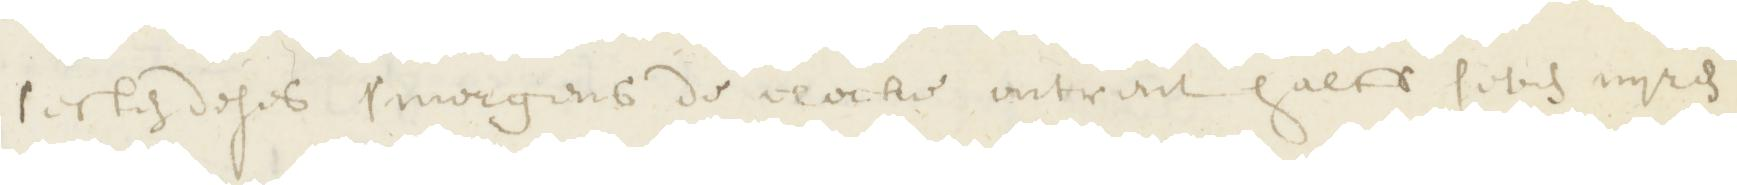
testen deses smorgens de clocke ontrent halff seven uyren
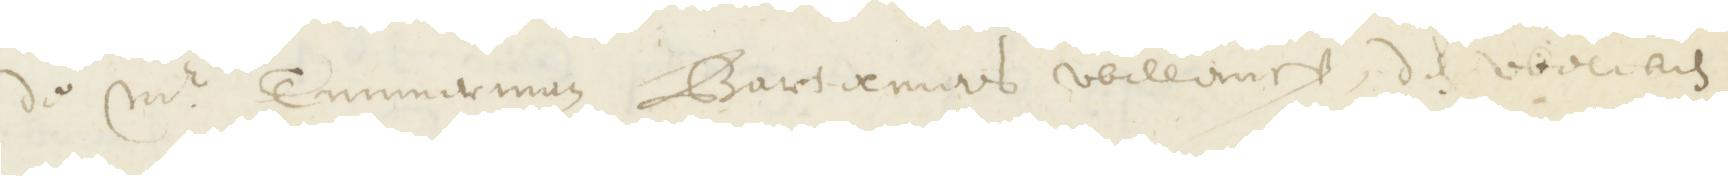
de m.r Timmermen Bartolemeus willemsz, de welcken
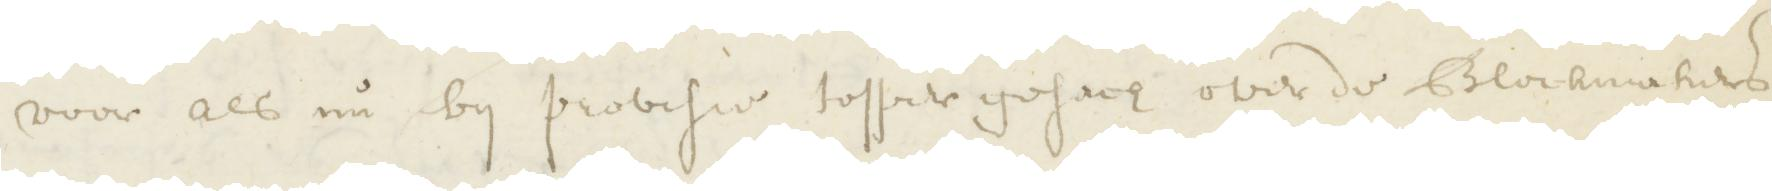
voor als nu by provisie topper gesach over de Blockmaekers
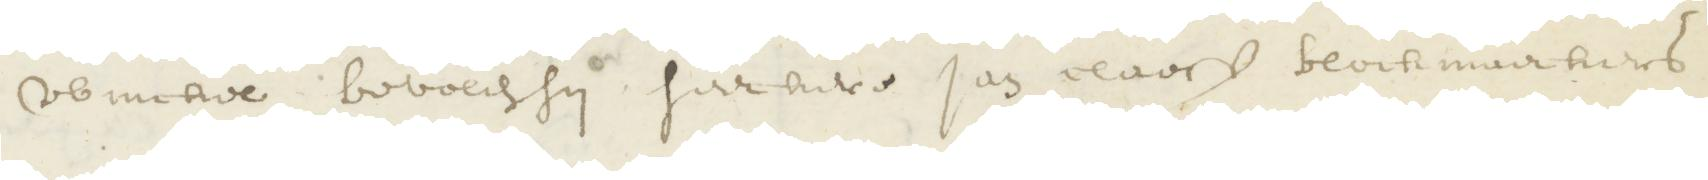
winckel bevolen sij seeckers Jan claesz blockmaeckers
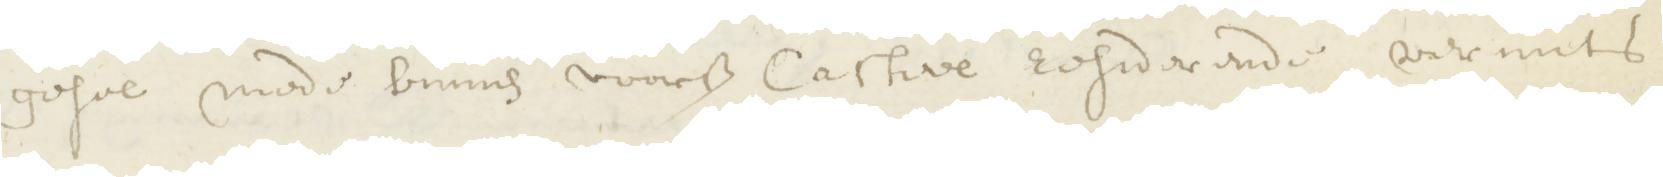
gesel mede binnen voorsz Casteel residerende vermits
